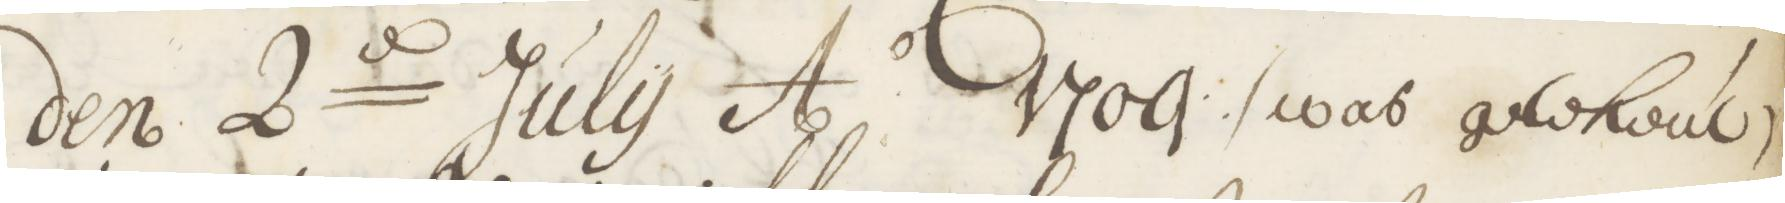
den 2=e Julij A:o 1709 /was getekent)
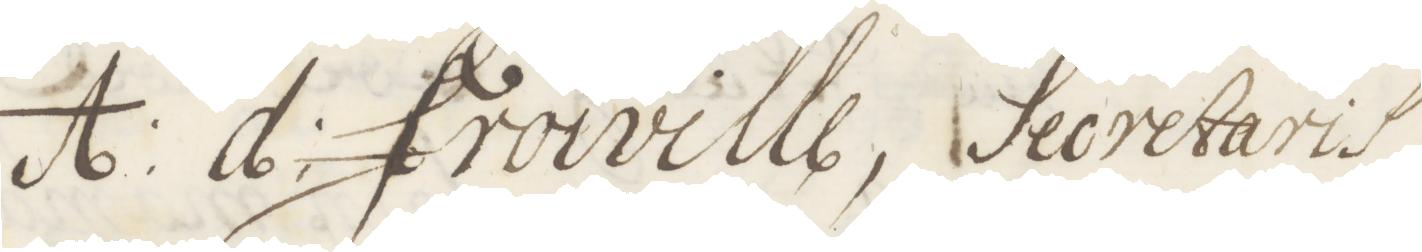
A: d: froiville, Secretaris.
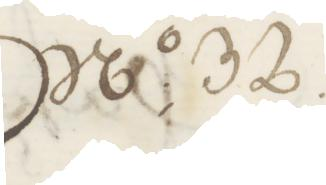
N:o 32
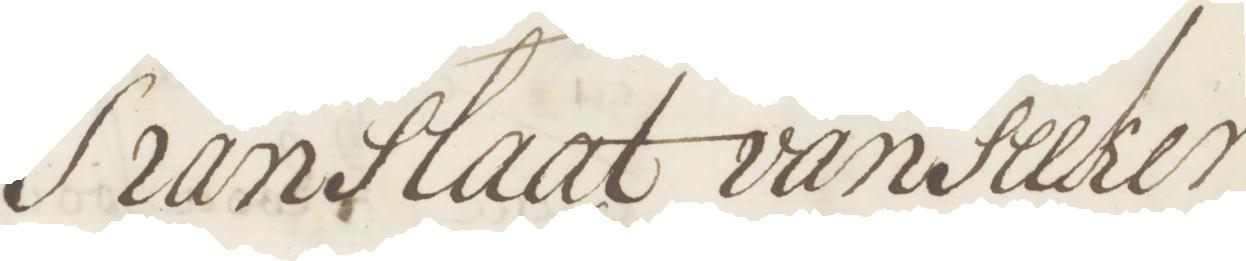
Translaat van seeker
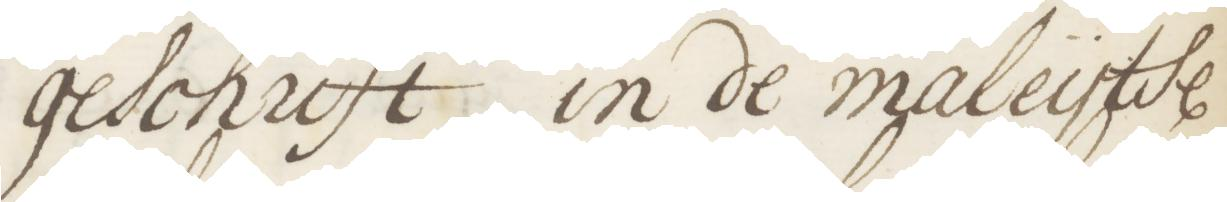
geschrijft in de maleijtse
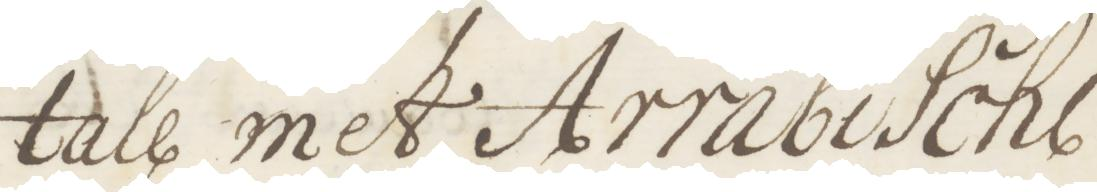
tale met Arrabische
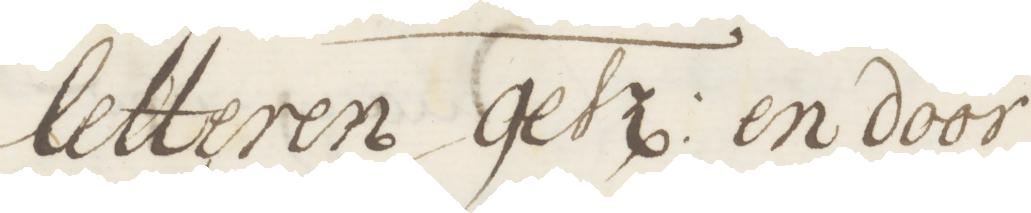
letteren gesz: en door
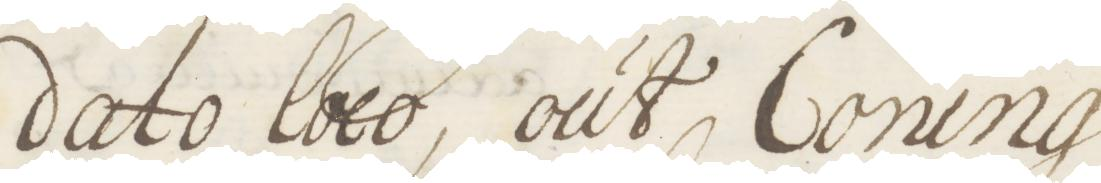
dato loco, out Coning
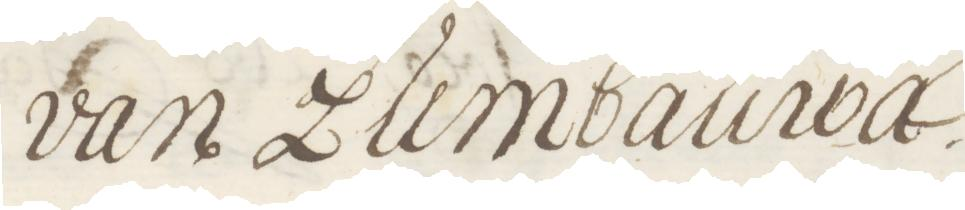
van Ziembauwa
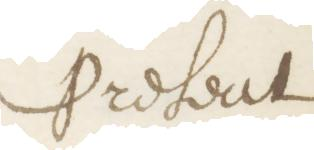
present
